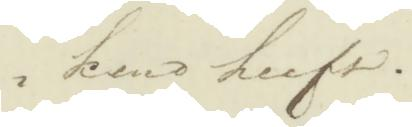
„kend heeft.
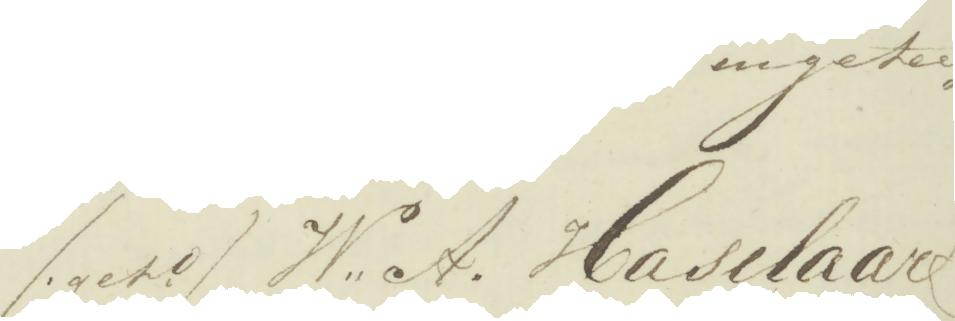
/.get,d/ W,, A. Haselaar
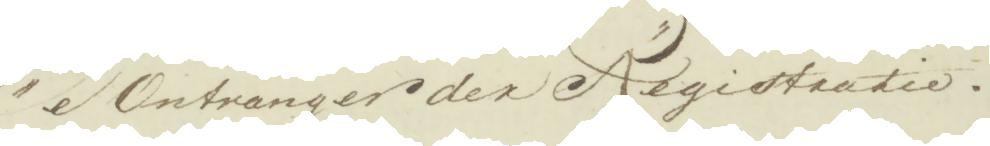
De Ontvanger der Registratie.
